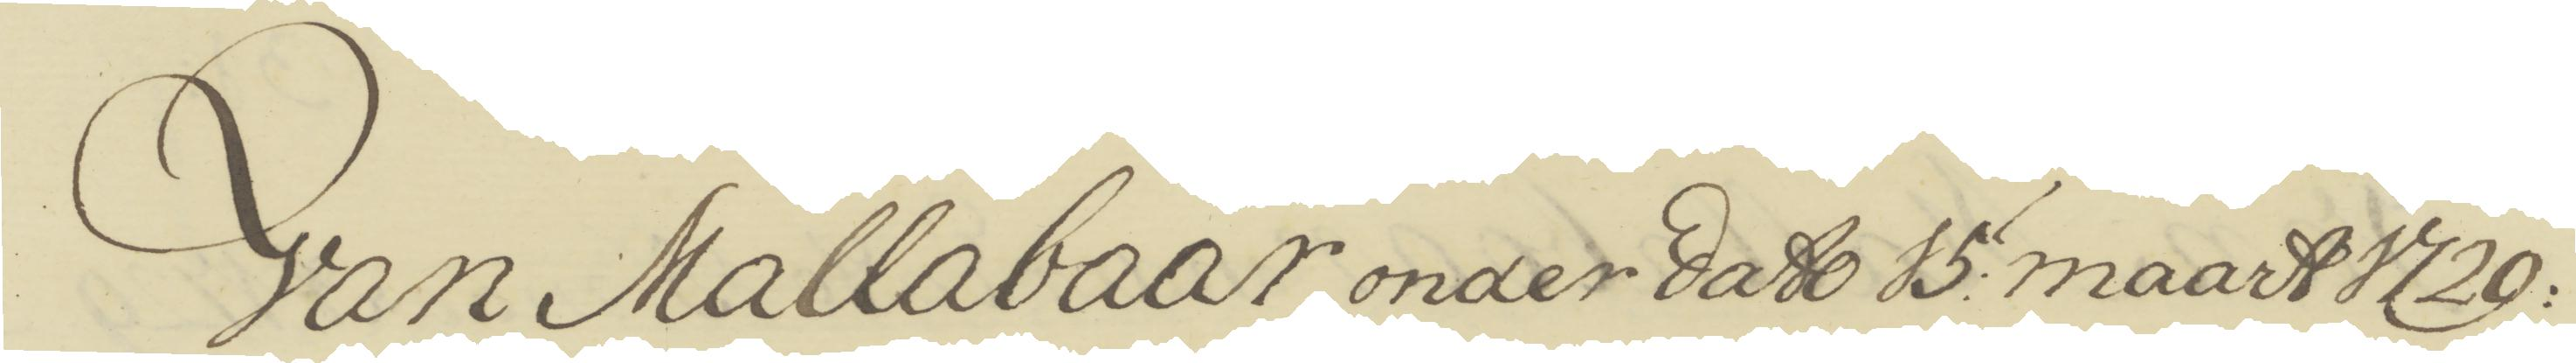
Van Mallabaar onder dato 15:' maart 1729:
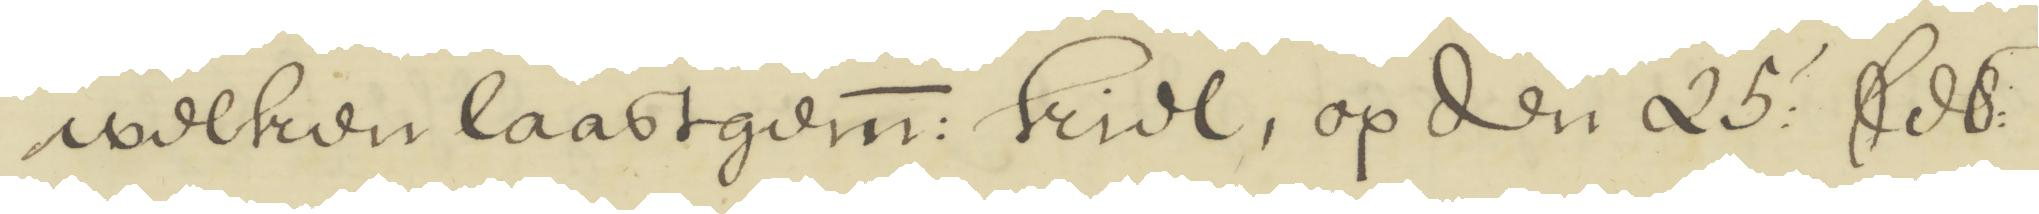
welken laast gem: kiel, op den 25:' feb:
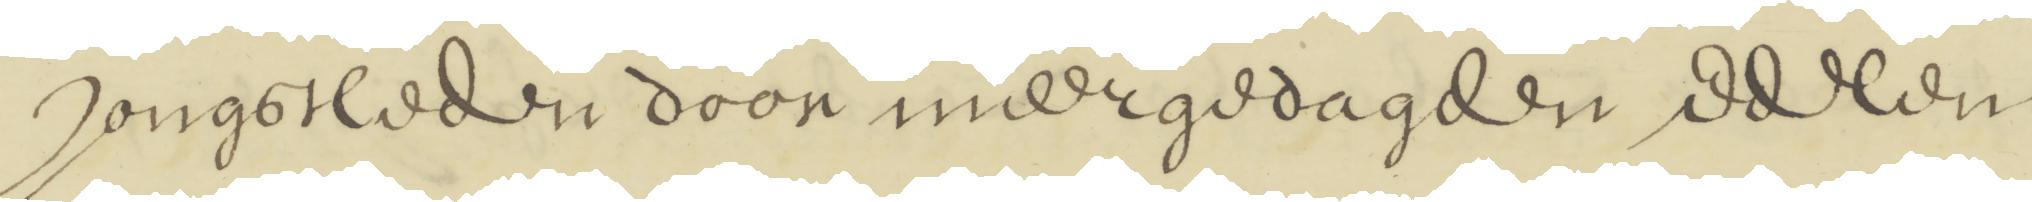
Jongstleden door meergedagden Edelen
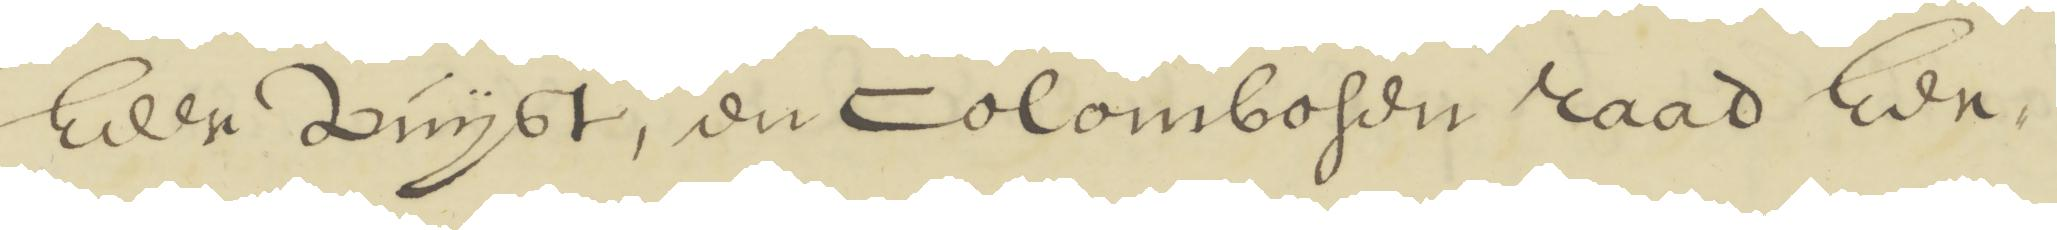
heer vuijst, en colombosen raad her„
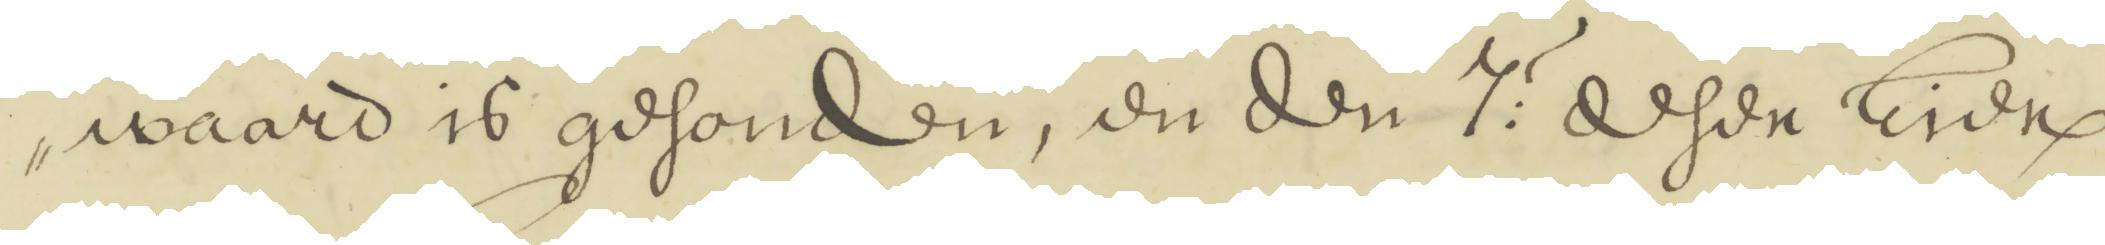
„waard is gesonden, en den 7:' deser hier
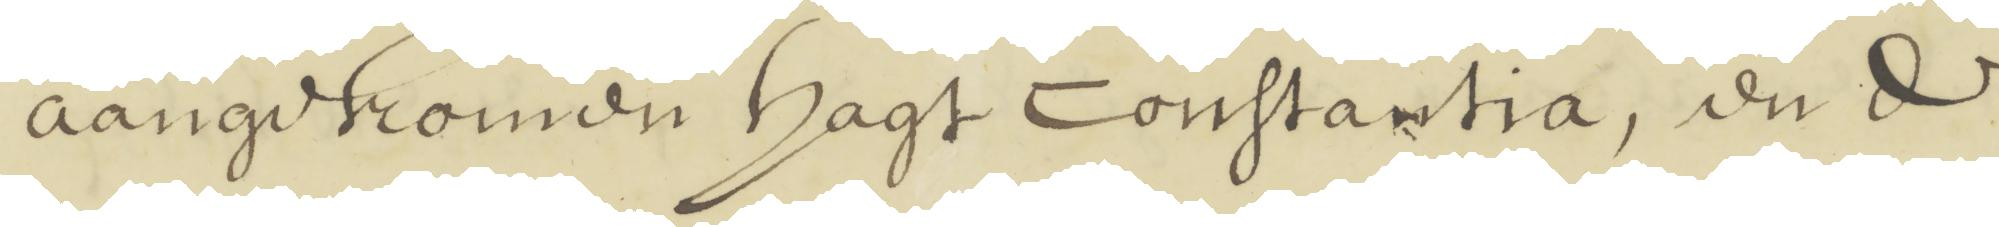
aangekomen 'tjagt constantia, en de
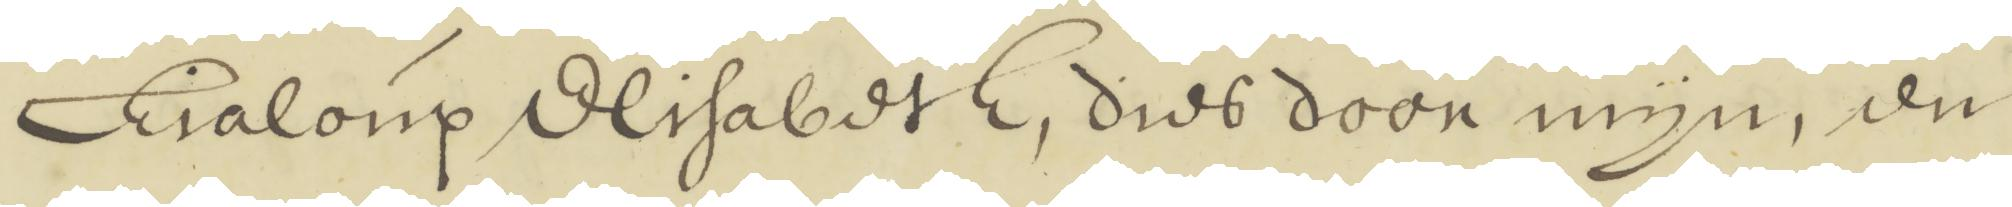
Chialoup Elisabeth, dies door mijn, en
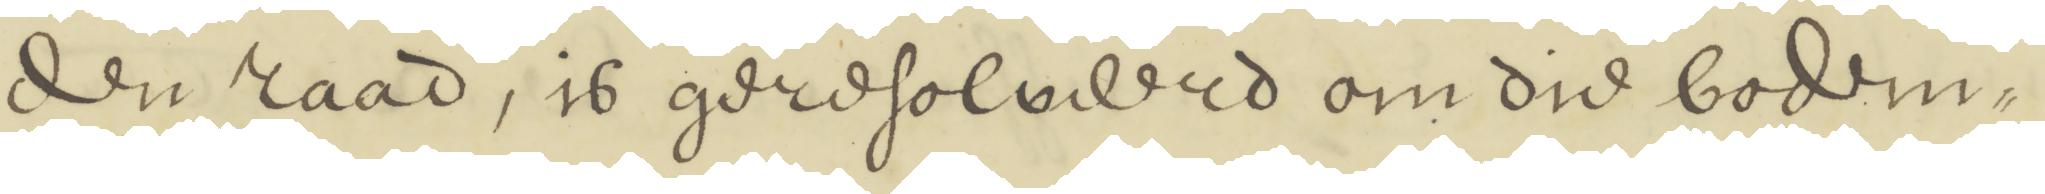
den raad, is geresolveerd om die bodem„
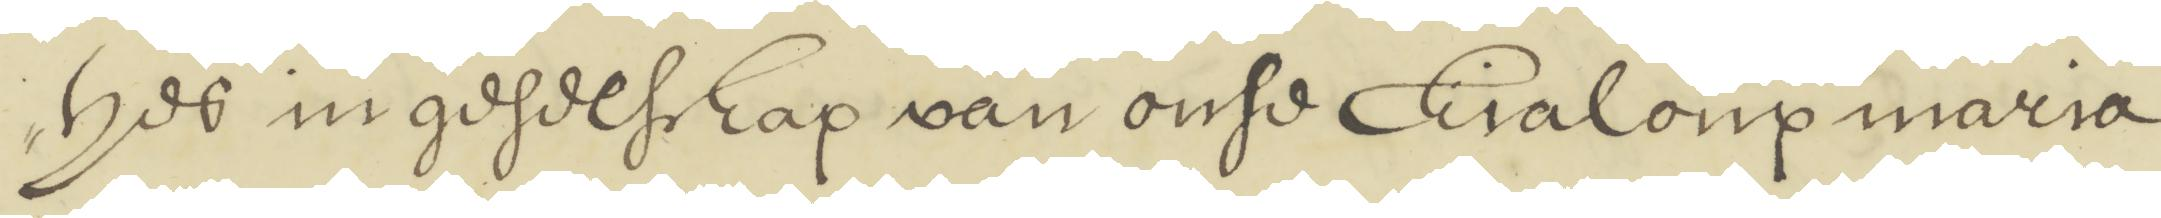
„tjes in geselschap van onse chialoup maria
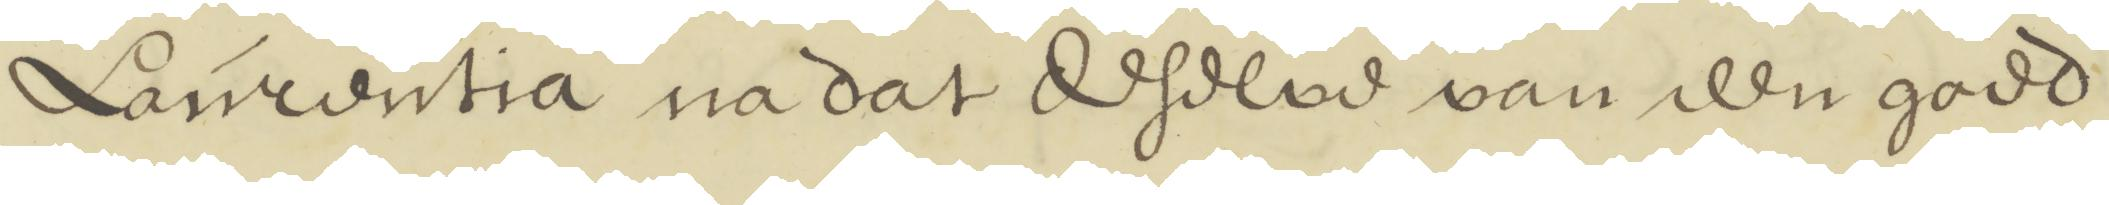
Laurentia na dat deselve van een goed
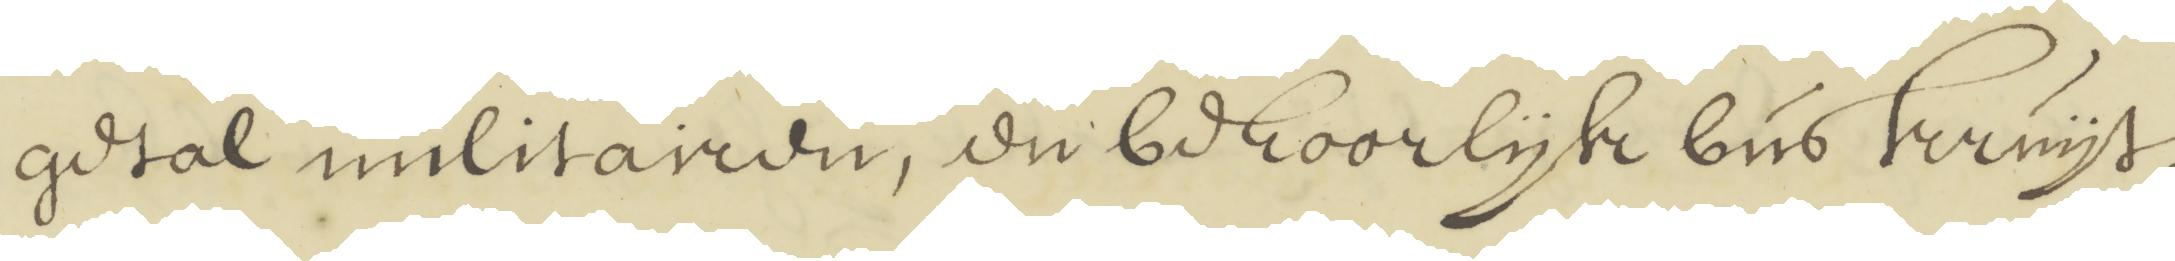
getal militairen, en behoorlijk buskruijt,
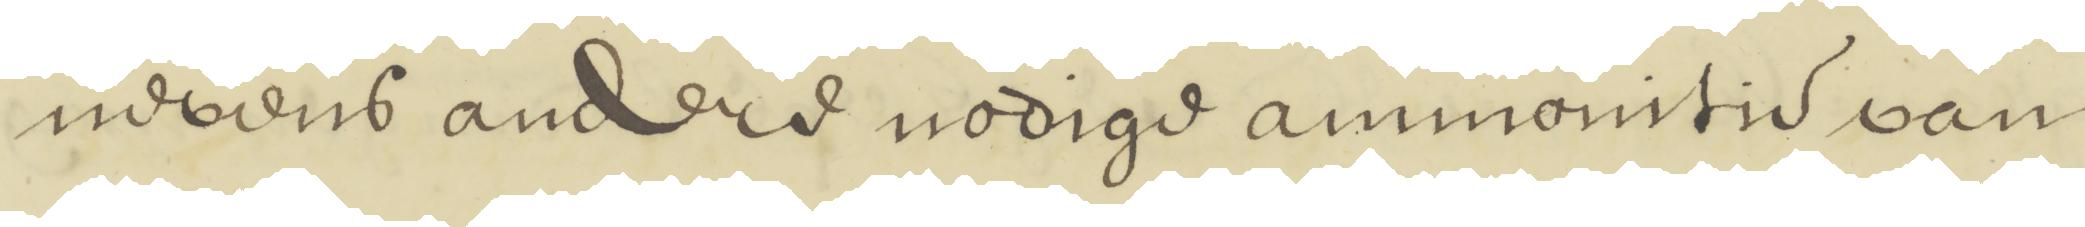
nevens andere nodige ammonitie van
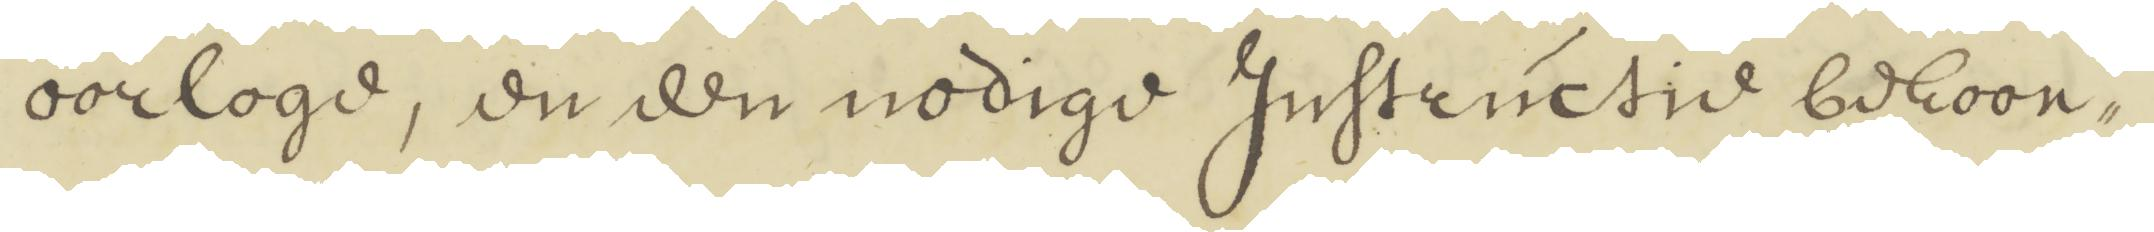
oorloge, en een nodige Jnstructie behoor„
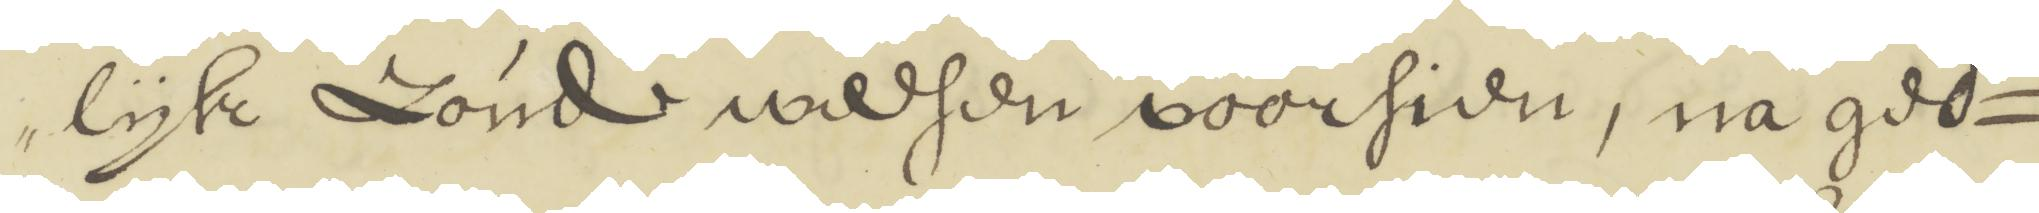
„lijk zoude weesen voorsien, na ged=te
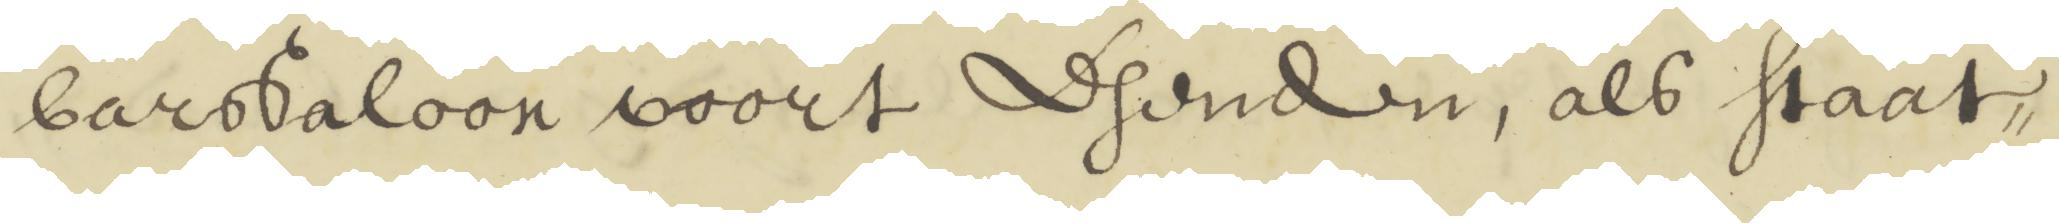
barssaloor voort te senden, als staat„
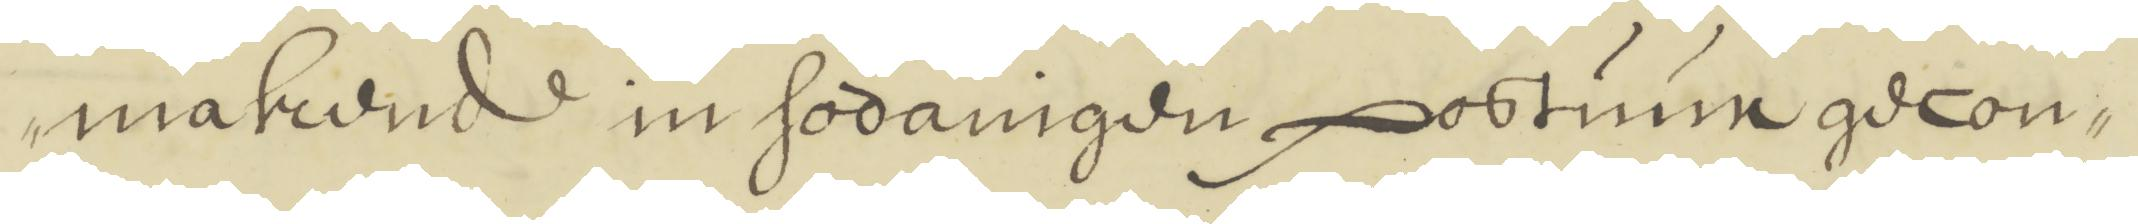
„makende in sodanigen postuur gecon„
